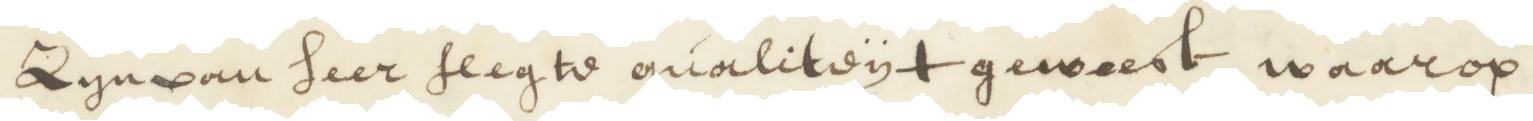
zyn van seer slegte qualiteijt geweest, waarop
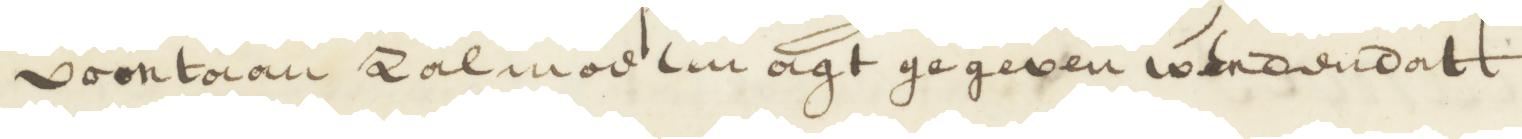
voortaan zal moeten agt gegeven werden dat
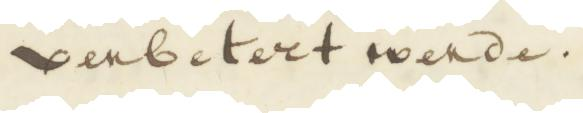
verbetert werde.
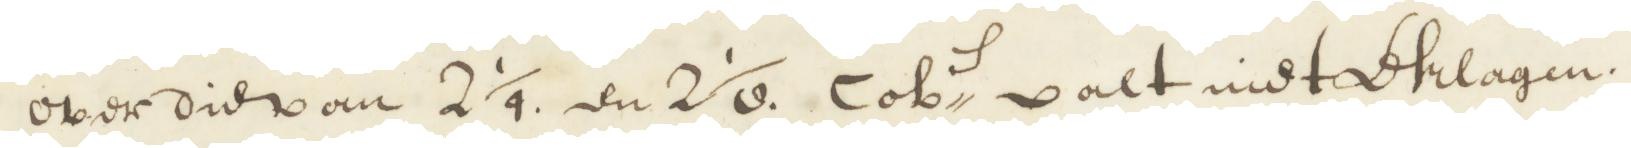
over die van 2¼. en 2 1/8. Cob„s valt niet te klagen.
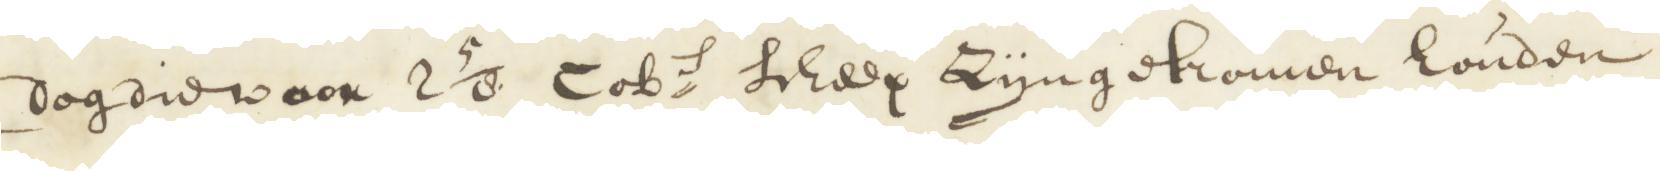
dog die voor 2 5/8. Cob=s scheep zijn gekomen houden
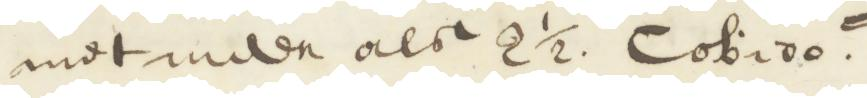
met meer als 2½. Cobido.
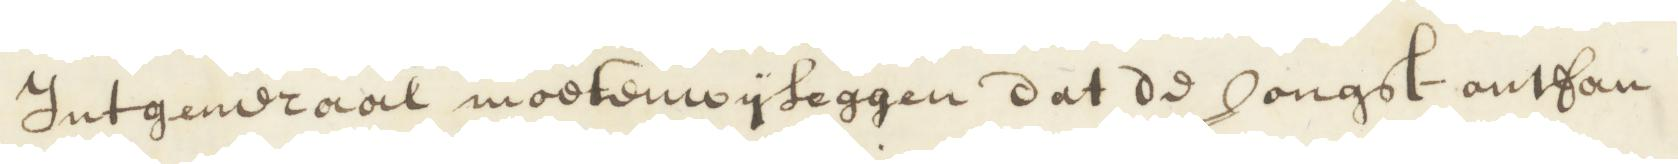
Int generaal moeten wij seggen dat de jongst ontfan
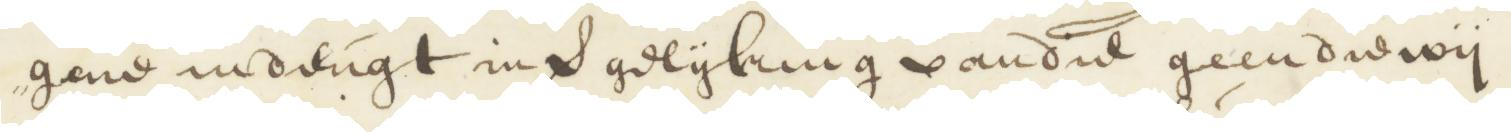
„gene in deugt in vergelijking van die geen die wij
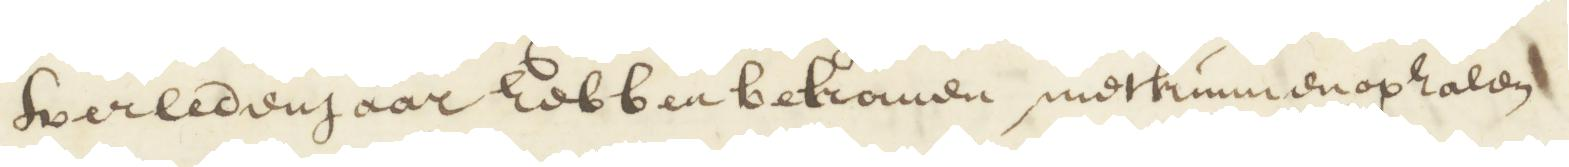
tverleden jaar hebben bekomen, niet kunnen op halen
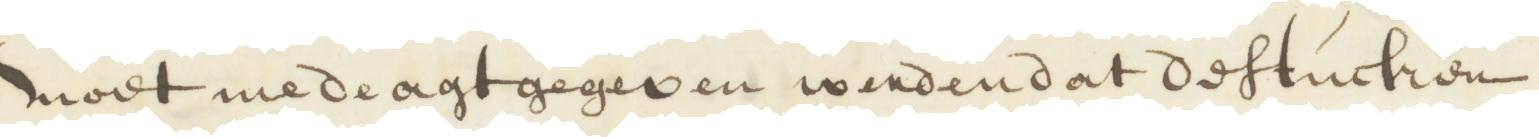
moet mede agt gegeven werden dat de stucken
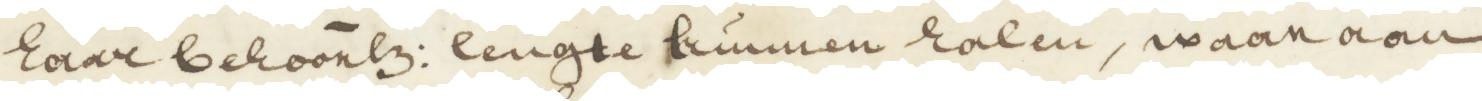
haar behoorlijk: lengte kunnen halen, waar aan
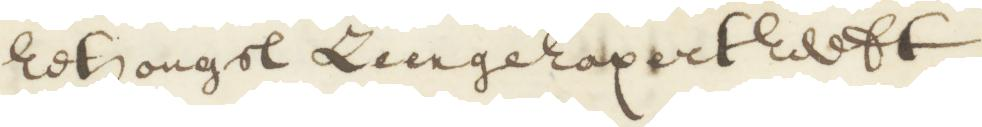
het jongst zeer gehapert heeft.-
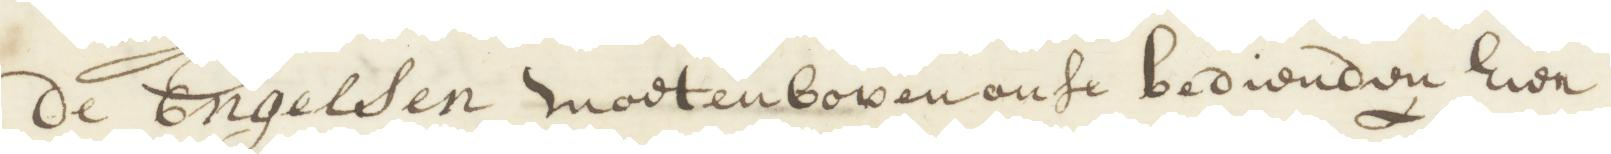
de Engelsen moeten boven onse bedienden hier
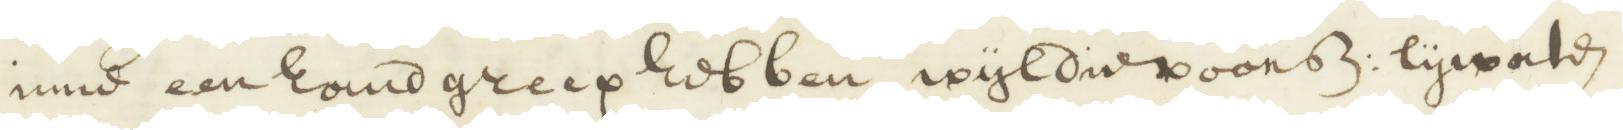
inne een hand greep hebben, wijl die voorsz: lijwaten
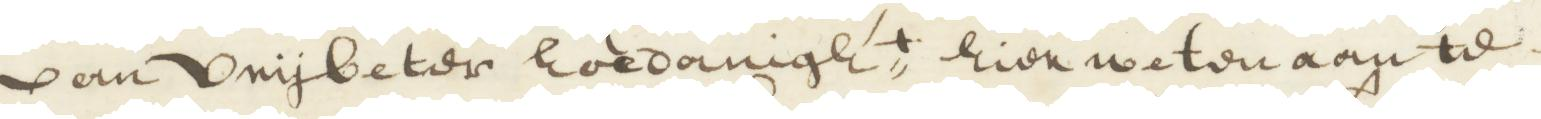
van vrij beter hoedanigh„t hier weten aan te
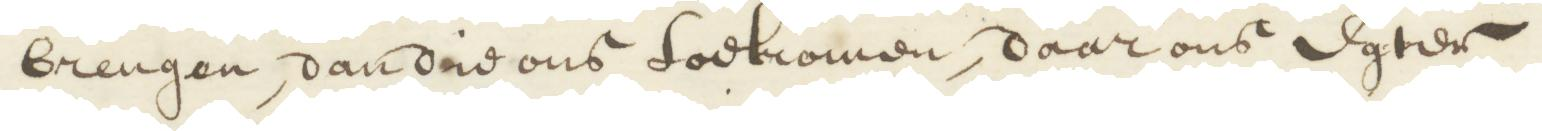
brengen, dan die ons toekomen, daar ons Egter
